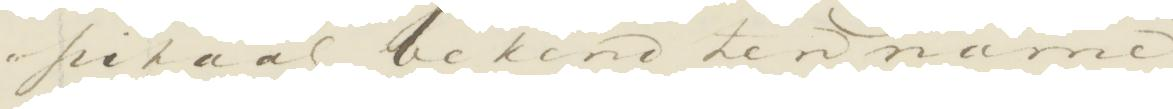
„pitaal bekend ten name
